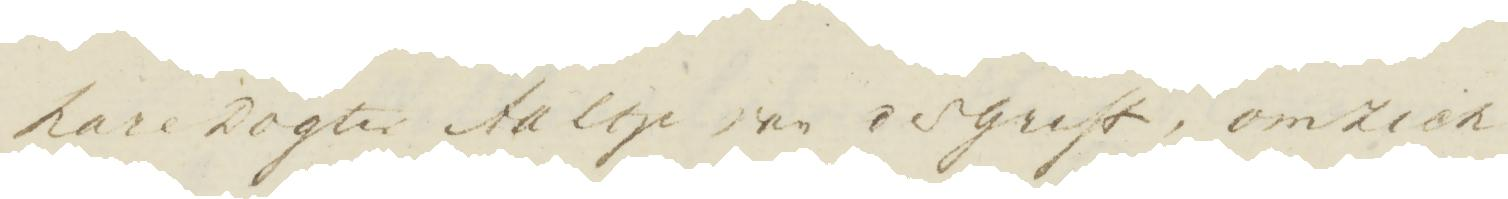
hare Dogter Aaltje van der grift, om zich
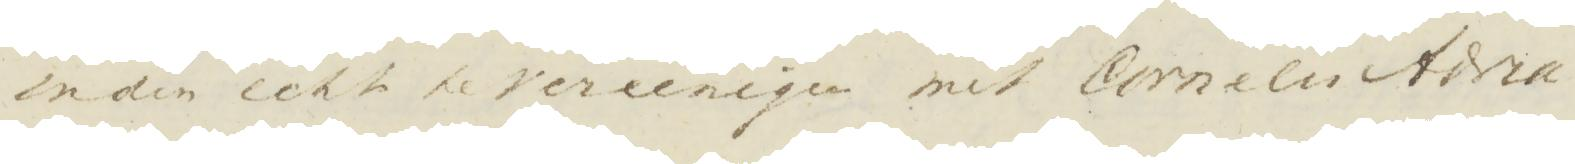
in den echt te vereenigen met Cornelis Adria
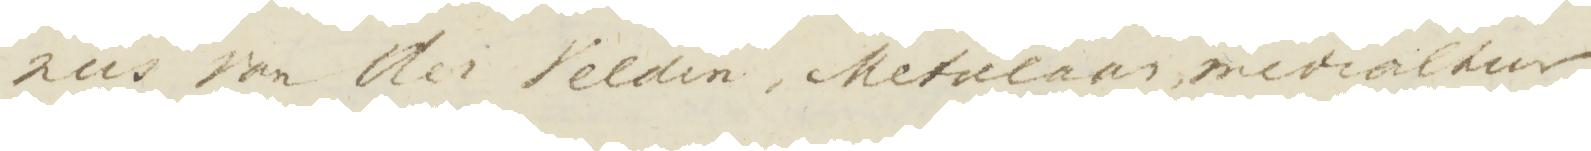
nus van der Velden, Metselaar, mede alhier
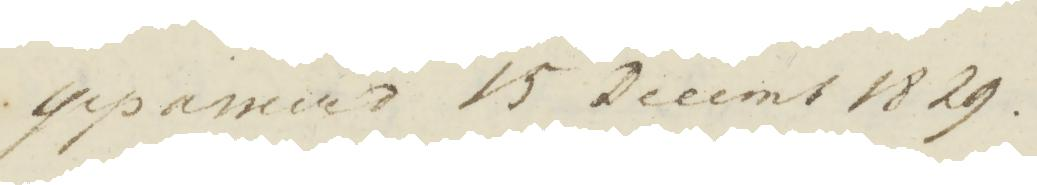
gepasseerd 15 Decemb 1829.
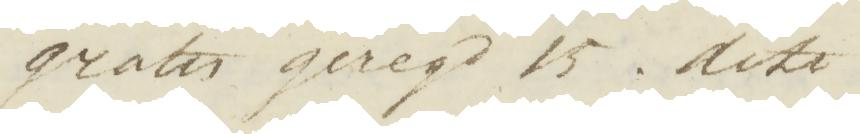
gratis geregd 15. dito
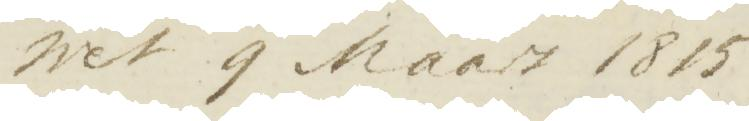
wet 9 Maart 1815
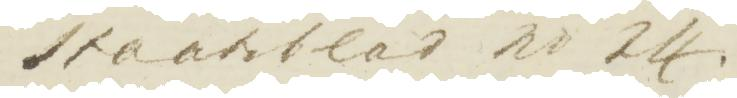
Staatsblad no 24.
